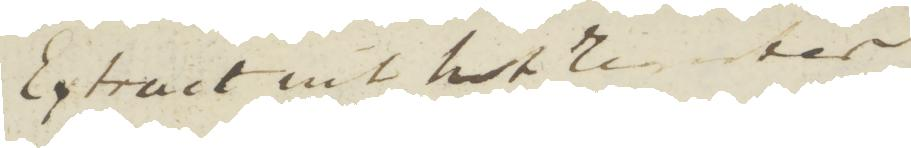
Extract uit het register
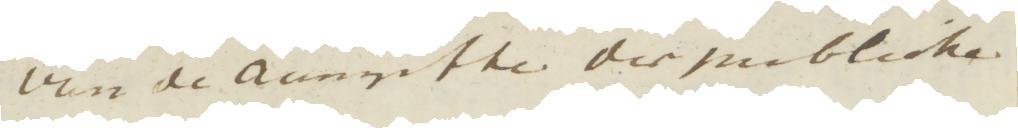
van de aangifte der publieke
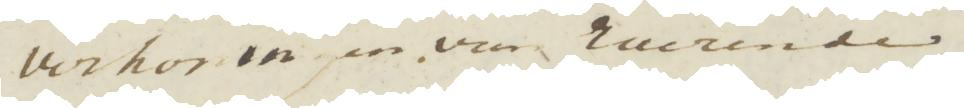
verkopingen van roerende
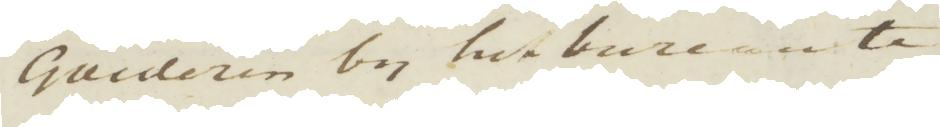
Goederen by het bureau te
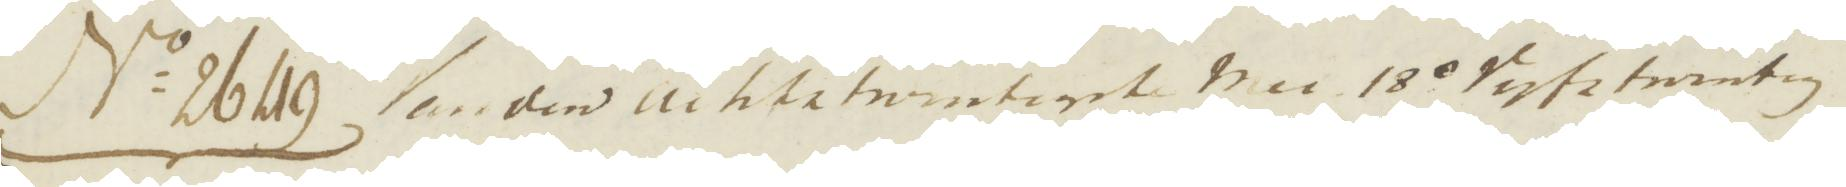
N=o 2649 Van den Acht en twintigste Mei 18.e Vijf en twintig
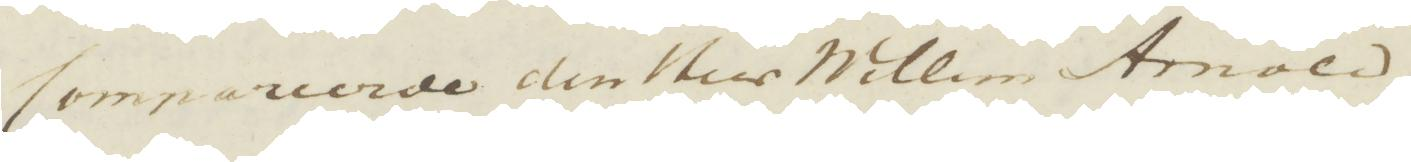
Compareerde den Heer Willem Arnold
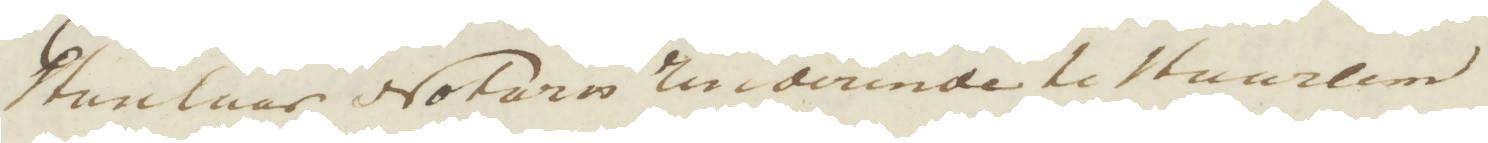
Haselaar Notaris residerende te Haarlem
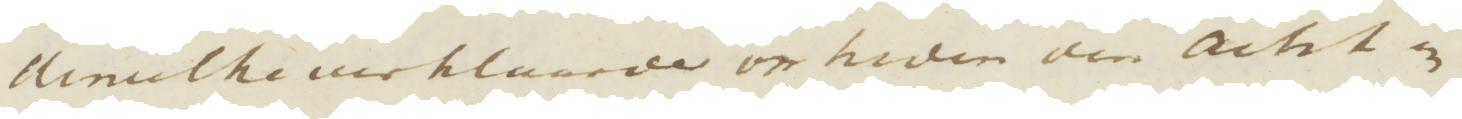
dewelke verklaarde op heden den acht en
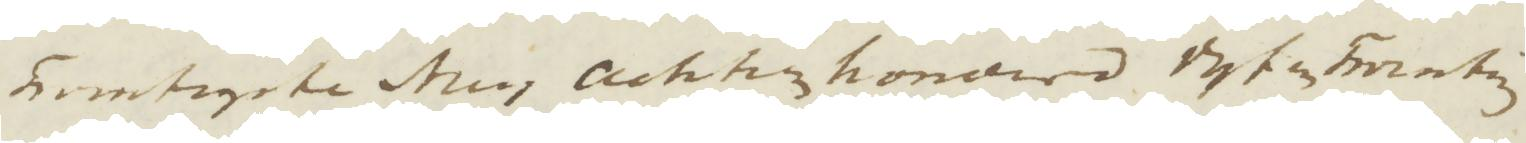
Twintigste Mey achtien honderd vyf en twintig
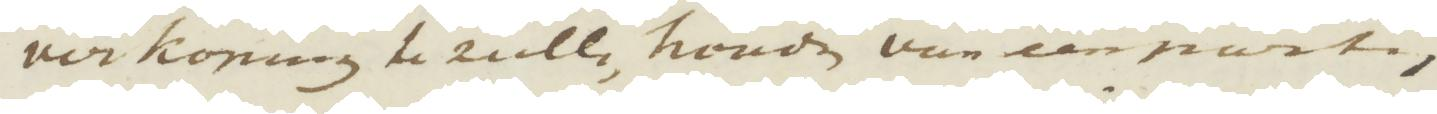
verkoping te zullen houden van een party
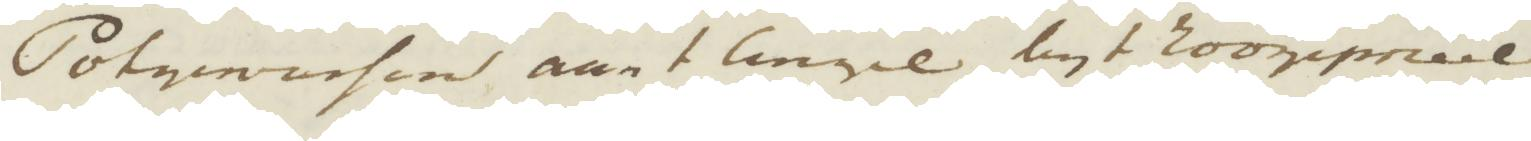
Potgewassen aan t Cingel by 't roozeprieel
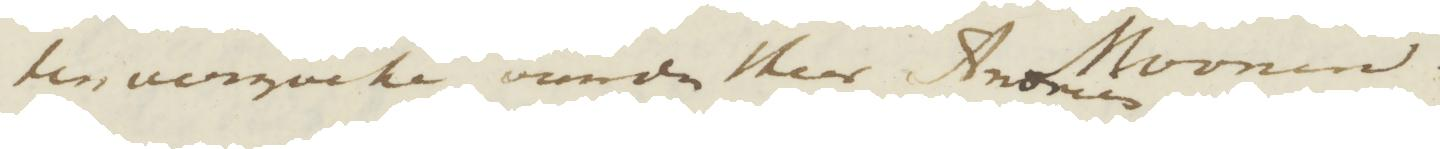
ten verzoeke van den Heer Andries Moonen
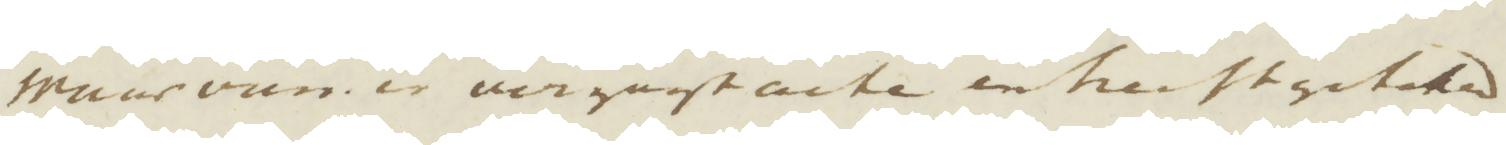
waarvan is verzogt acte en heeft getekend
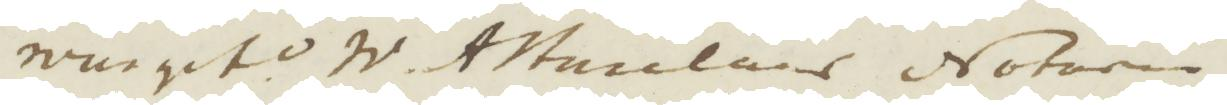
was get.d W. A Haselaar Notaris
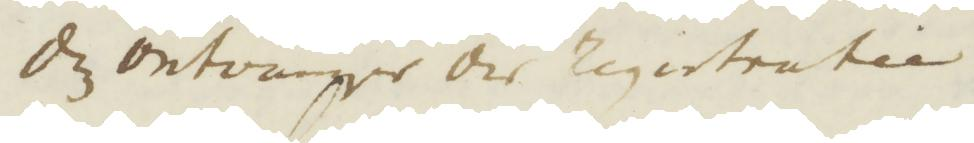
den ontvanger der registratie
